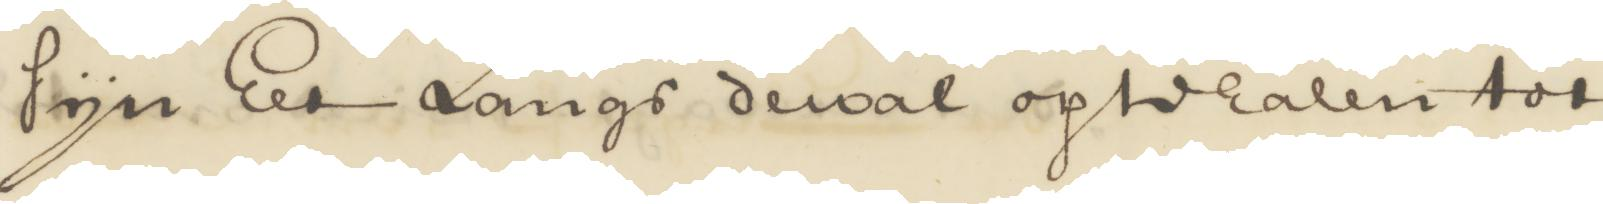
sijn het Langs dewal optehalen tot
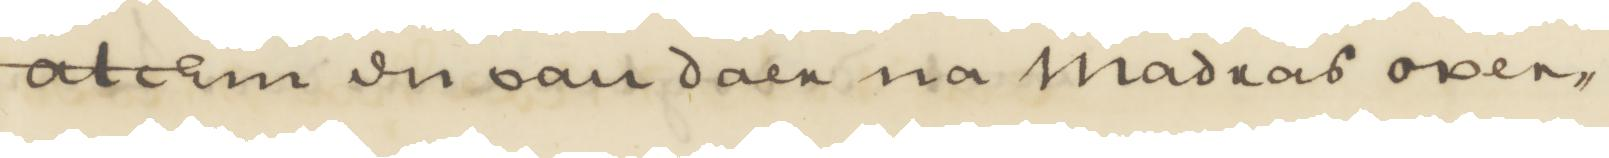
atchin en van daer na Madras over„
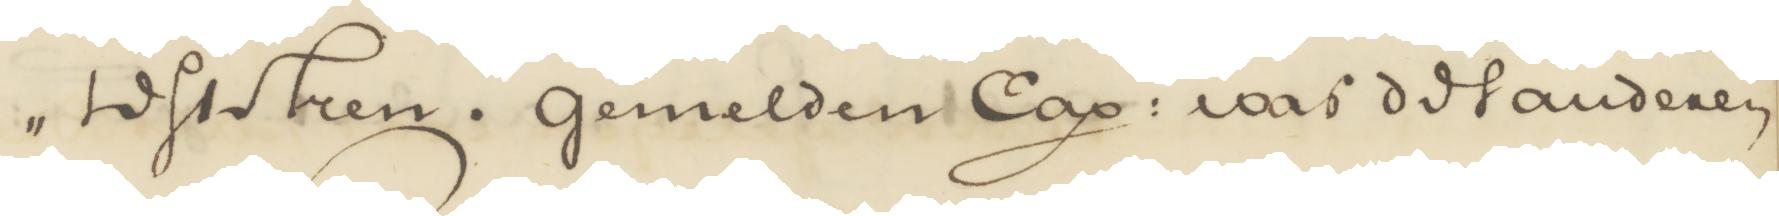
„ te steken. Gemelden Cap:n was desanderen
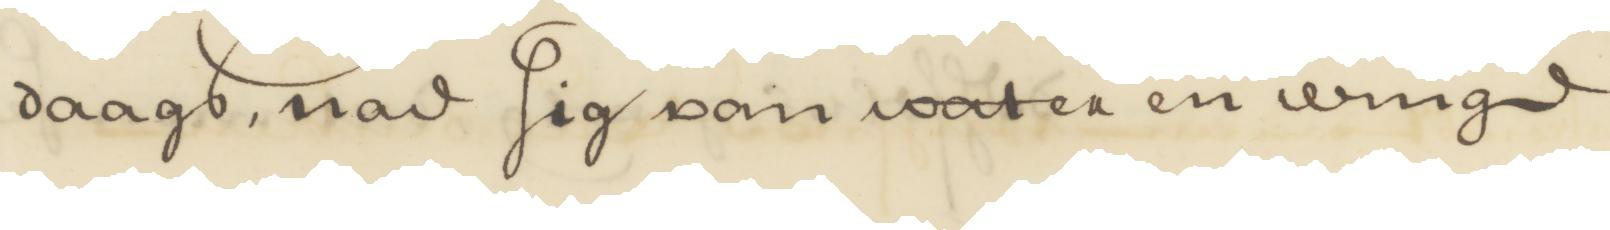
daags, nae sig van wat er en eenige
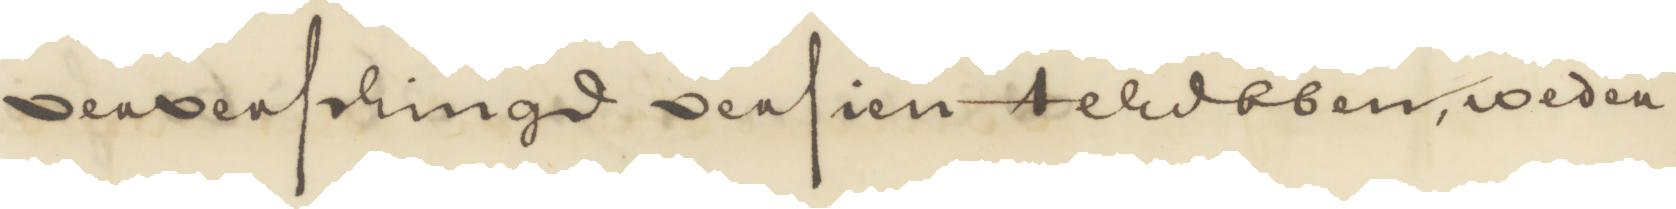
ververschinge versien te hebben, weder
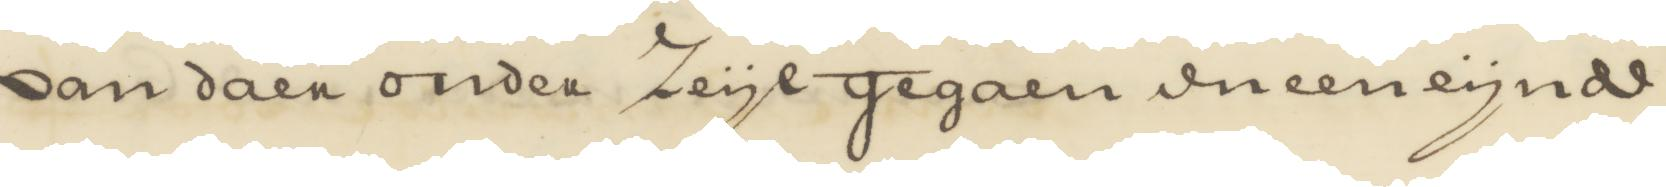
van daer onder zeijl gegaen en een eijnde
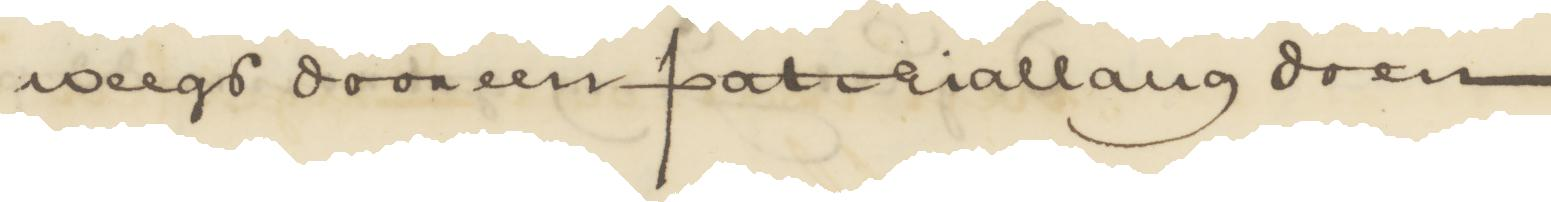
weegs door een patchiallang doen
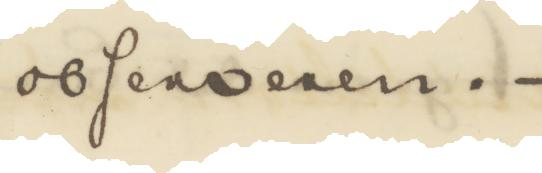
observeren.
